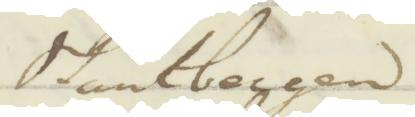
V Santbergen
